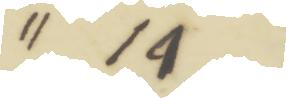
„ 14
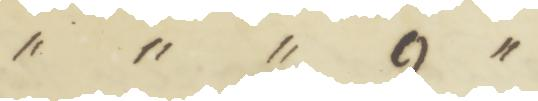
„ „ „ 9 „
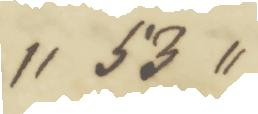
„ 53 „
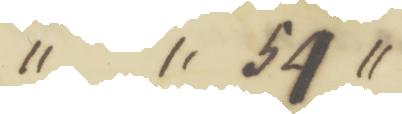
„ „ 54 „
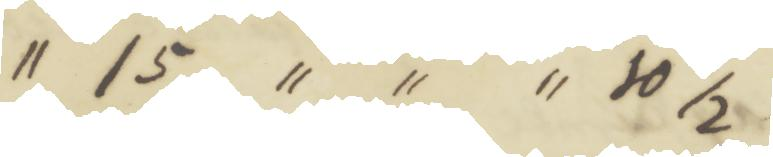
„ 15 „ „ „ 10½
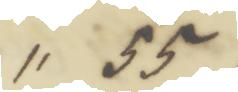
„ 55
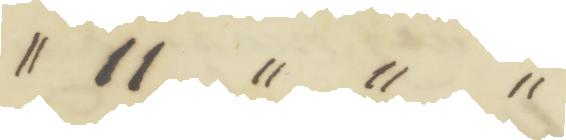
„ 11 „ „ „
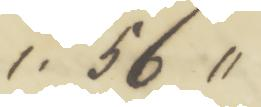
56 „
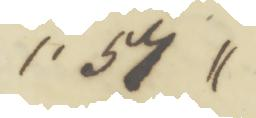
57 „
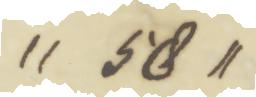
„ 58 „
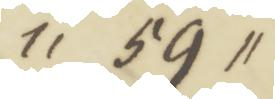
„ 59 „
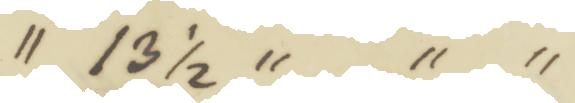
1 13½ „ „ „
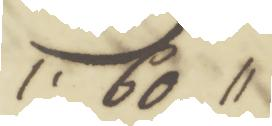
„. 60 „
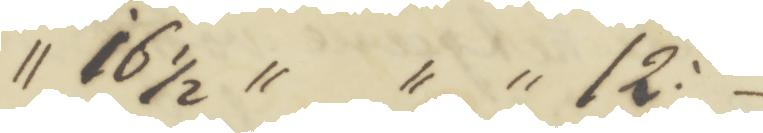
1 16½ „ „ „ 12: —
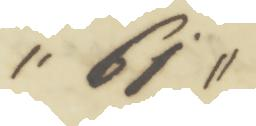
„ 61 „
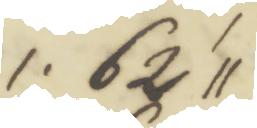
62„
